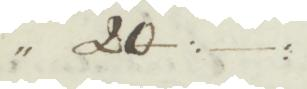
„ 20 —: —:
